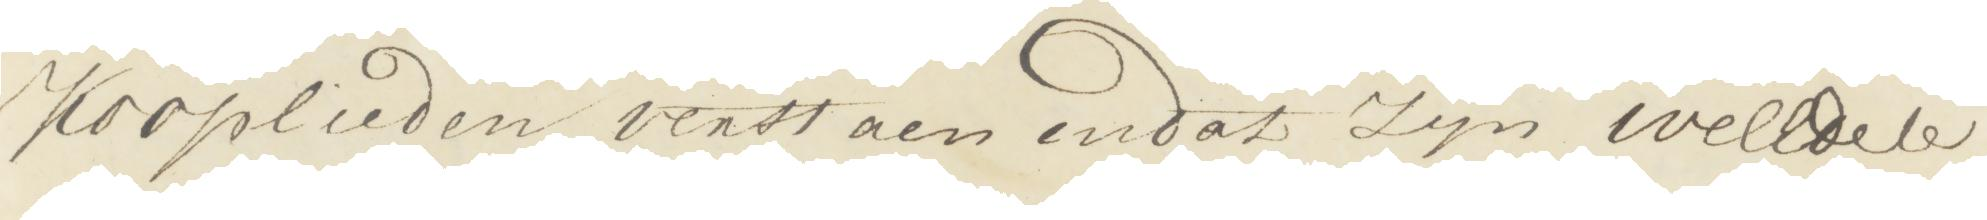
kooplieden verstaen en dat zijn welEdele
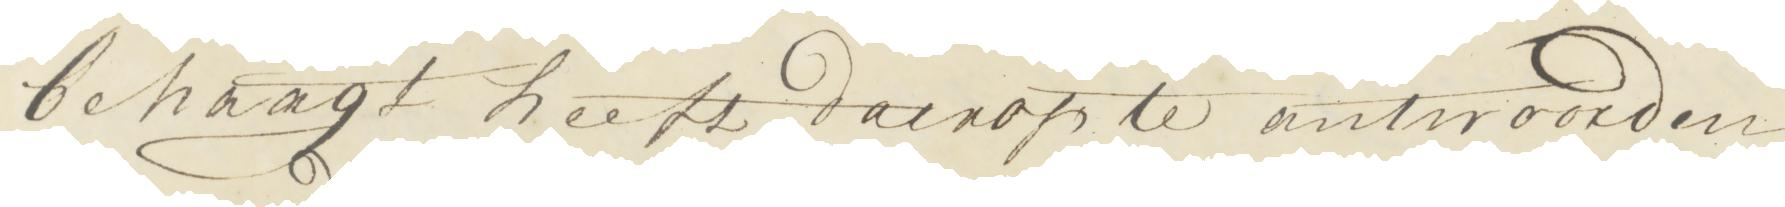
behaagt heeft daerop te antwoorden
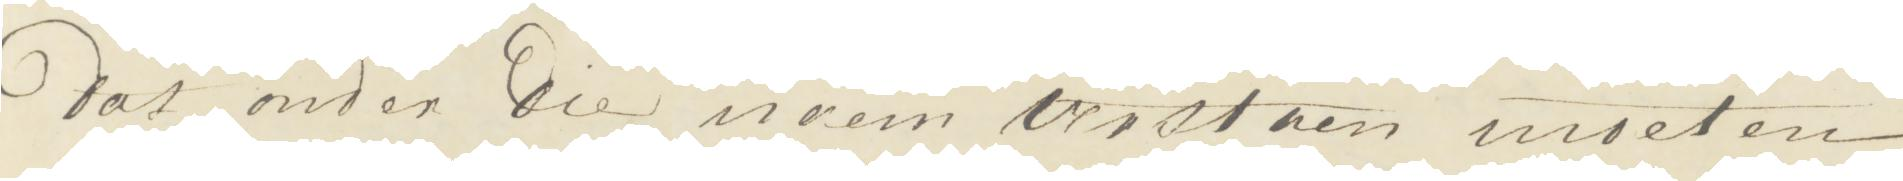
dat onder die naem verstaen moeten
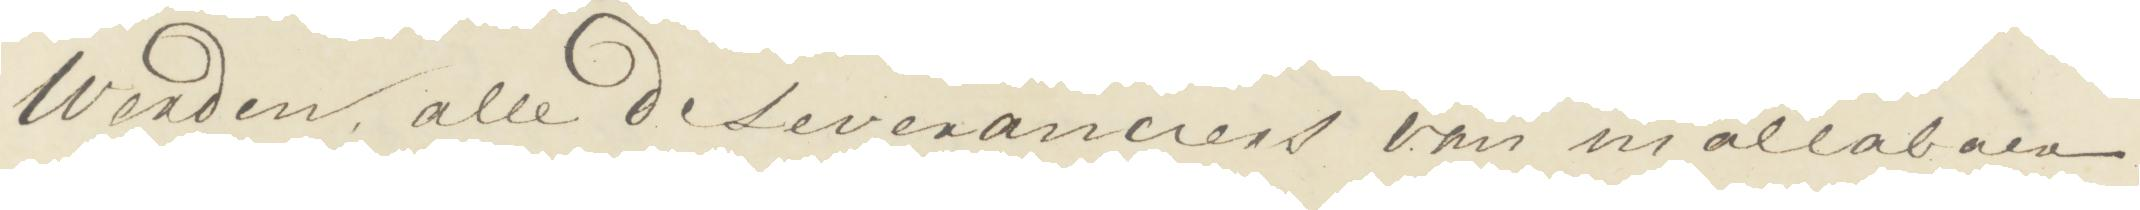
werden, alle de leveranciers van mallabaer
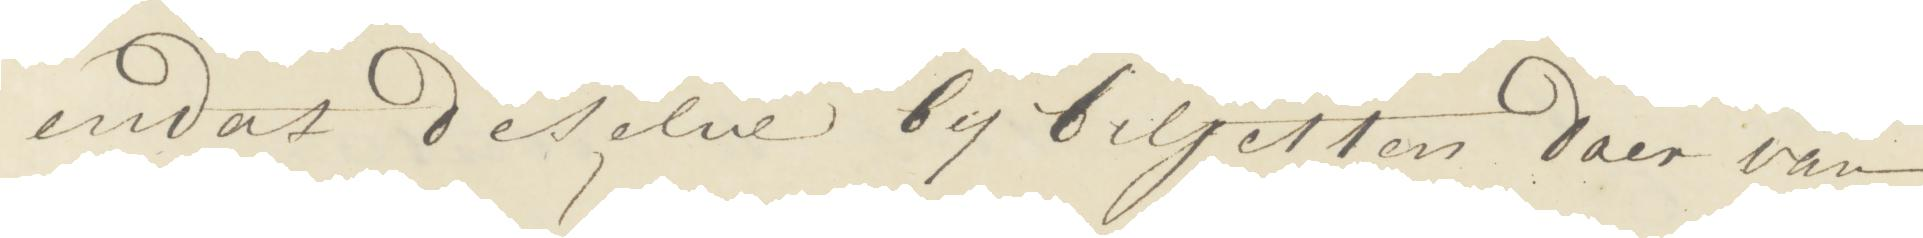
endat deselve bij biljetten daer van
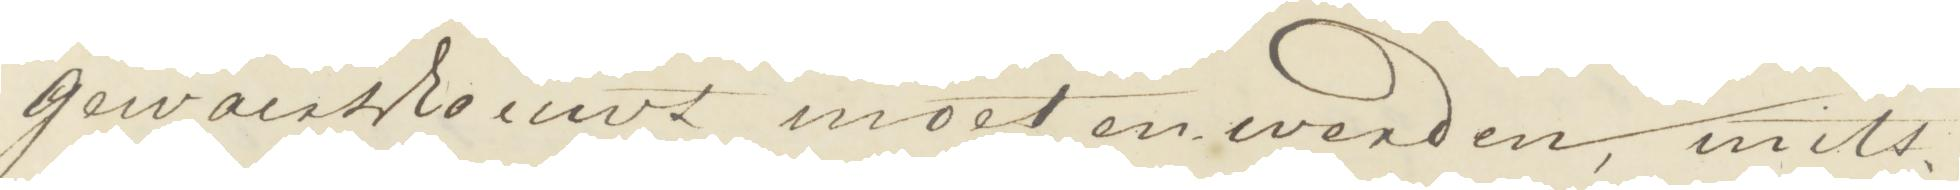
gewaerschouwt moeten werden, mits,
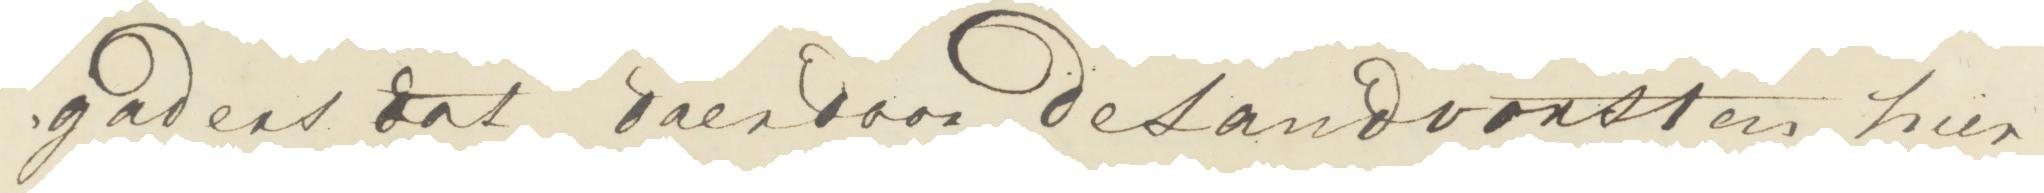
,gaders dat daerdoor delandvorsten hier
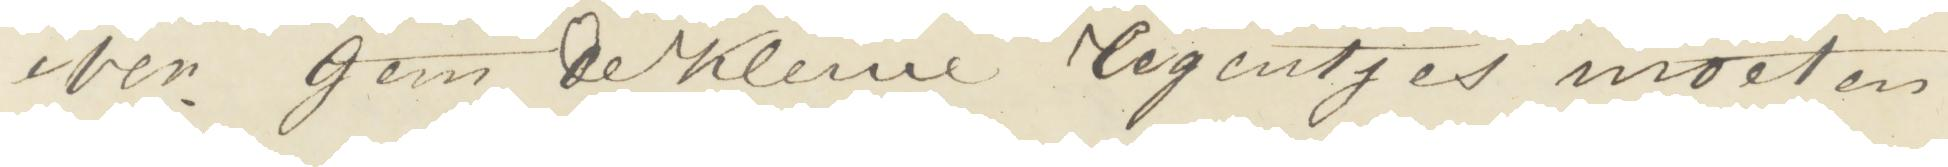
over gem de kleine regentjes moeten
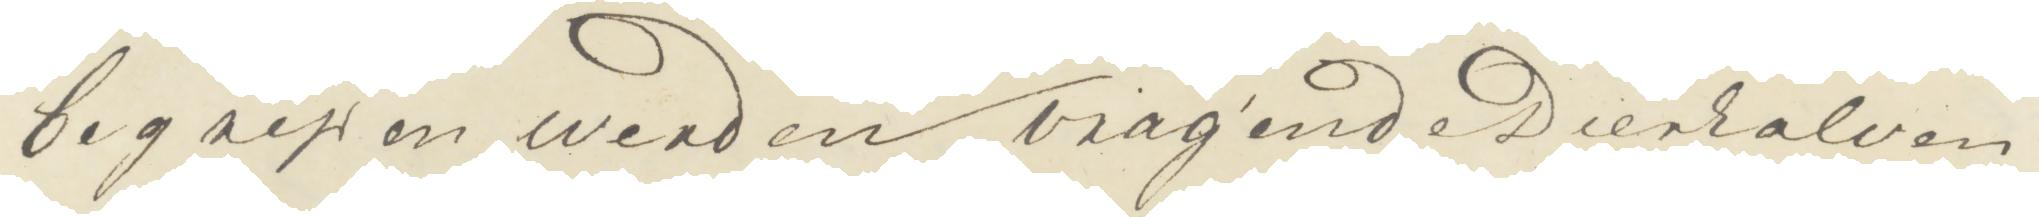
begrepen werden, vragende Dierhalven
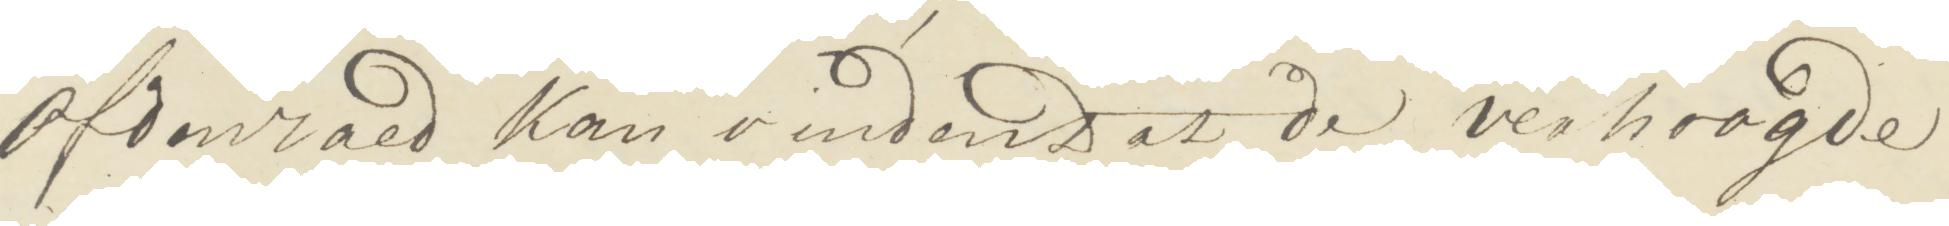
of denraed kan vinden dat de verhoogde
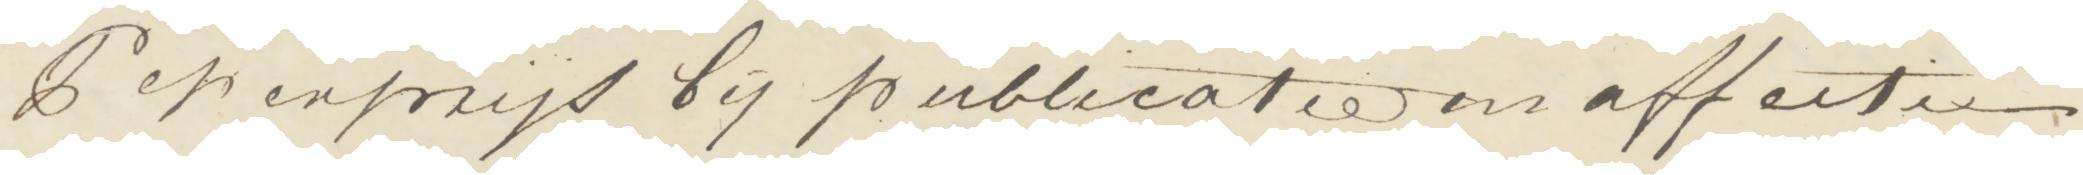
Peperprijs bij publicatie en affectie
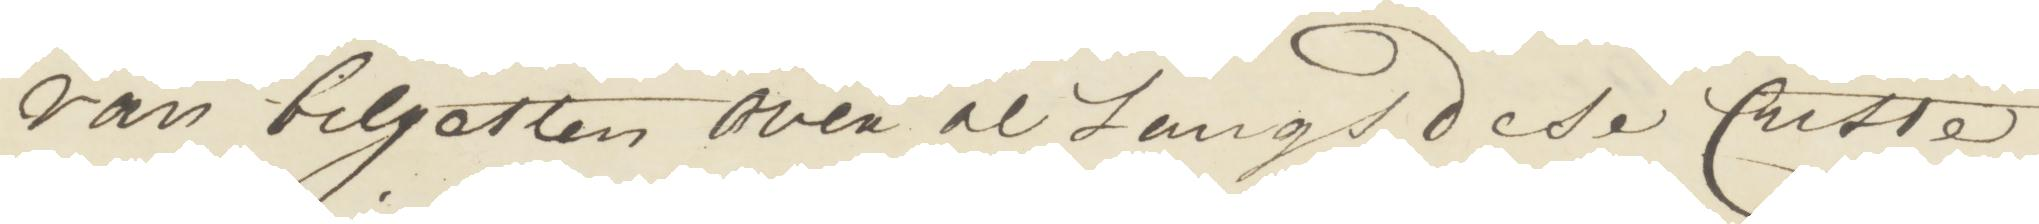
van biljetten over al langs dese Custe
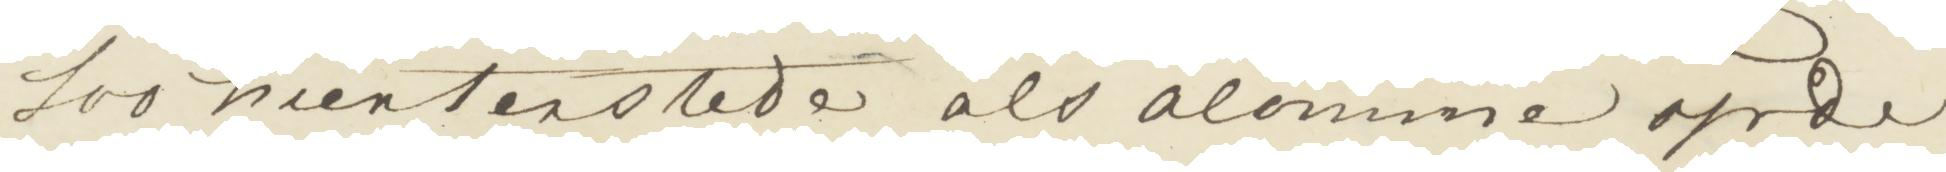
soo hier terstede als alomme op de
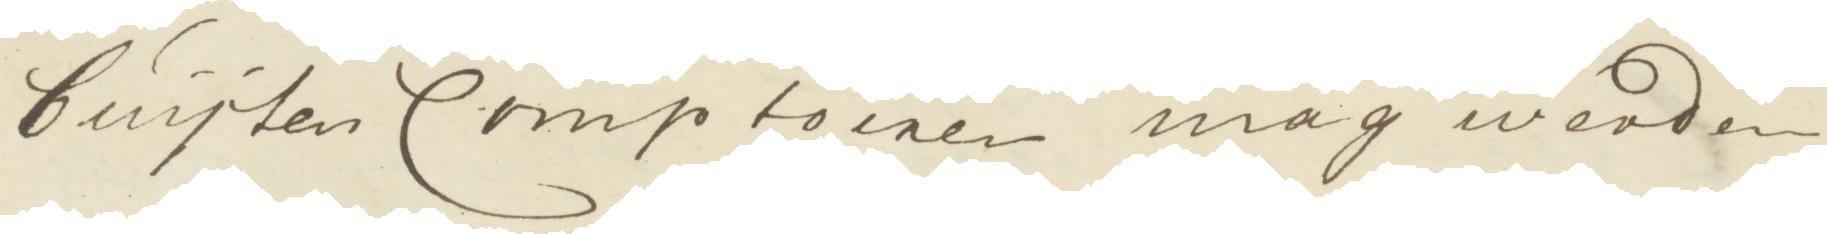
buijten Comptoiren mag werden
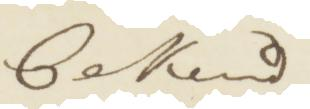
bekend
